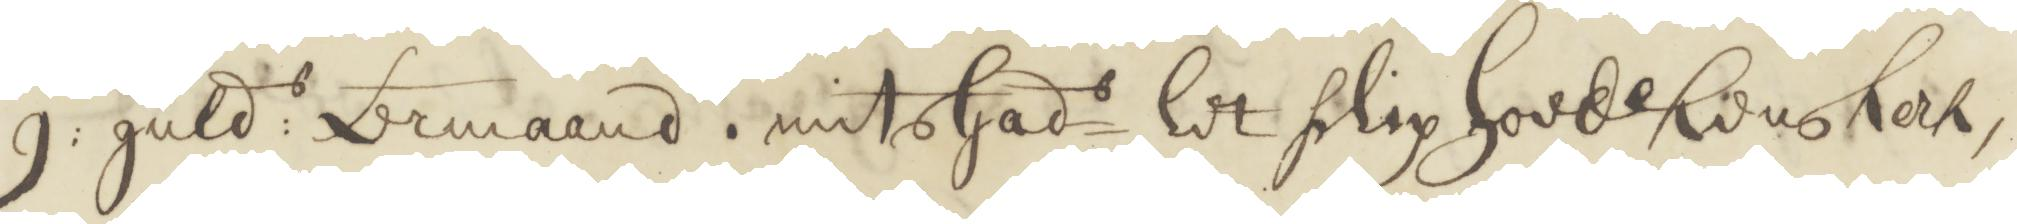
9: guld:s termaand. mitsgad=s het schip hoedekenskerk,
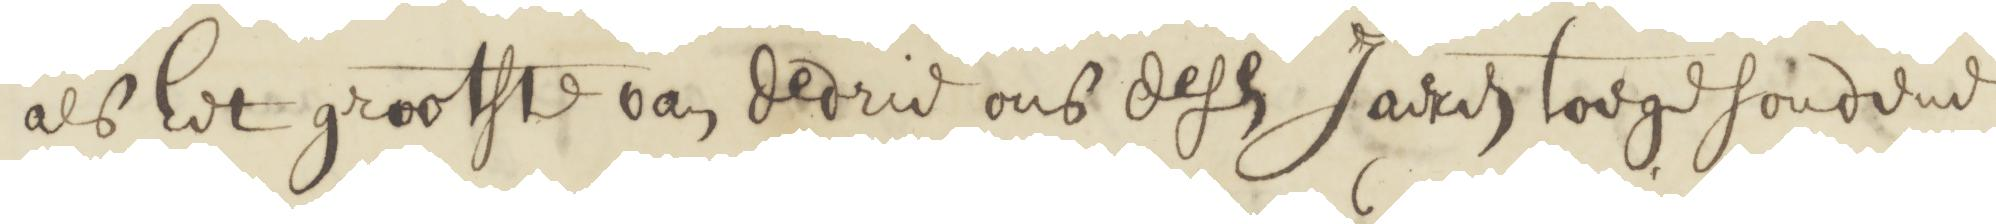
als het grootste van de drie ons desen Jaeren toegesondene
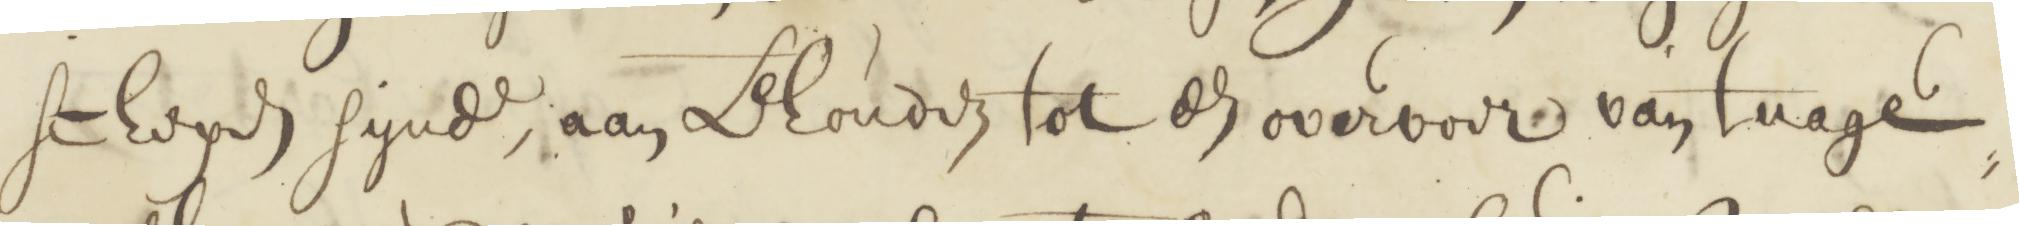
schepen sijnde, aan tehouden tot den overvoer van 't nage„
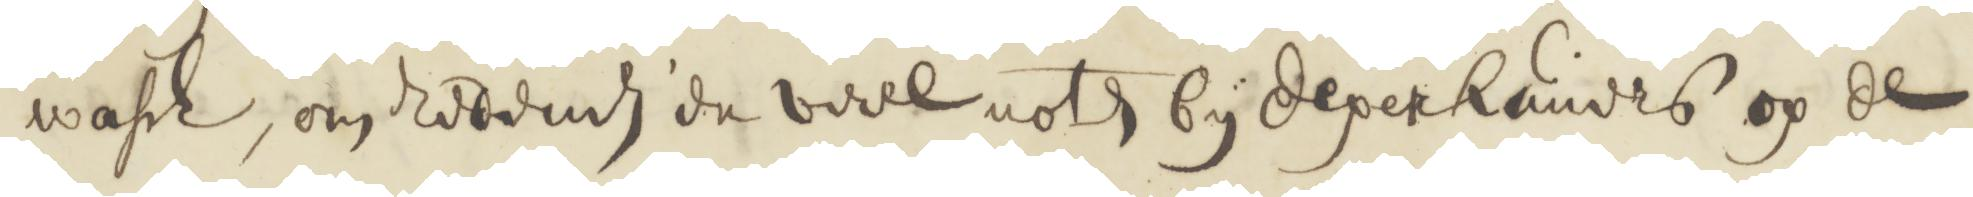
wasch, om redenen 'er veel noten bij deperkeiners op de
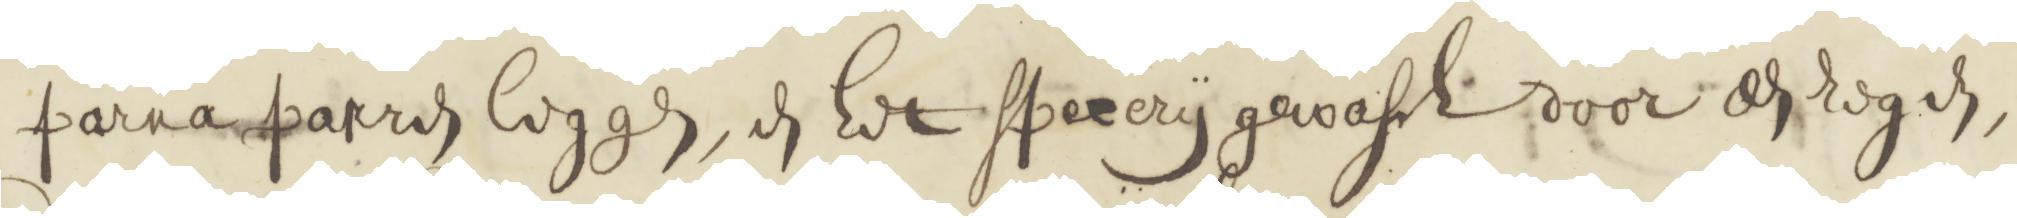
parra parren leggen, en het specerij gewasch door den regen,
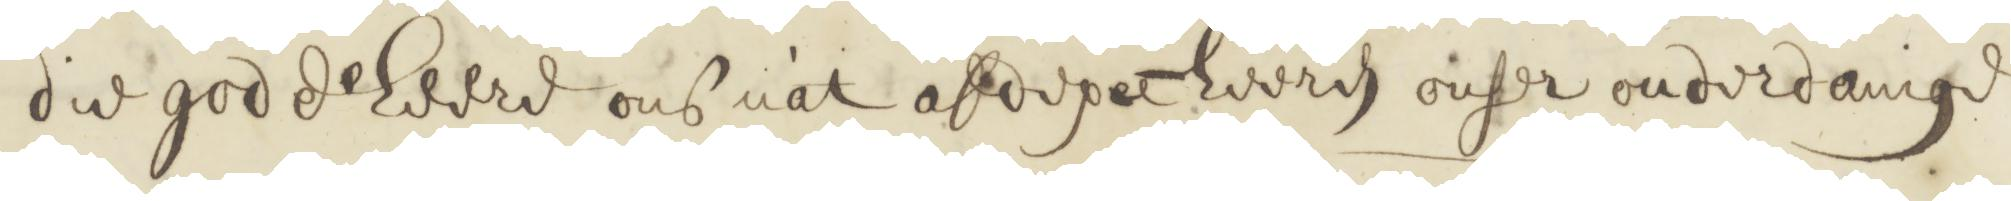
die god de heere ons na't afdepecheeren onser onderdanige
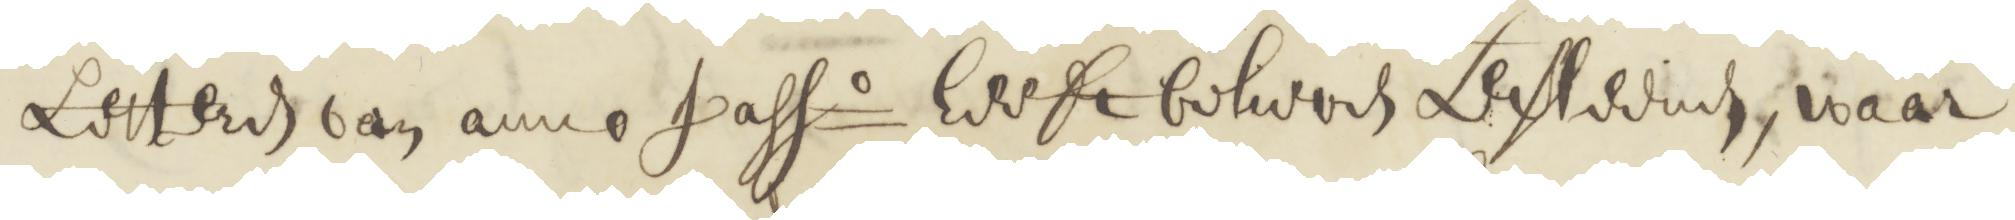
Letteren van anno pass=o heeft believen te verleenen, waar
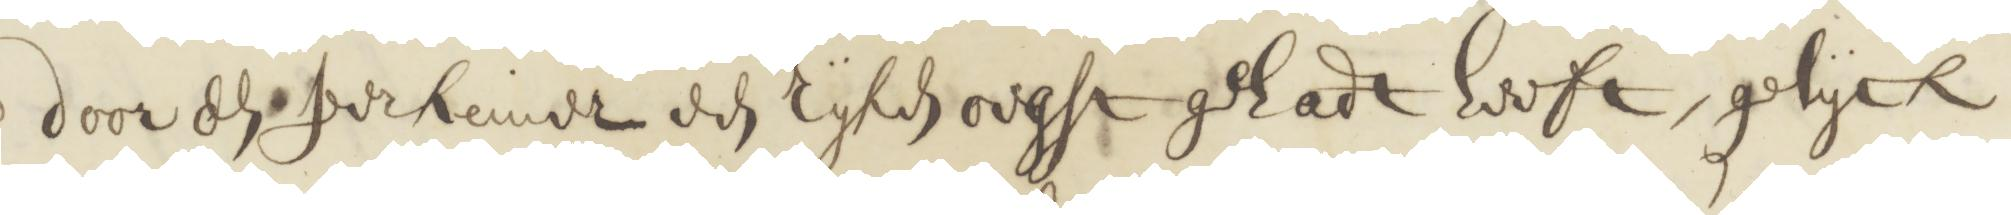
door den perkenier een rijken oegst gehadt heeft, gelijck
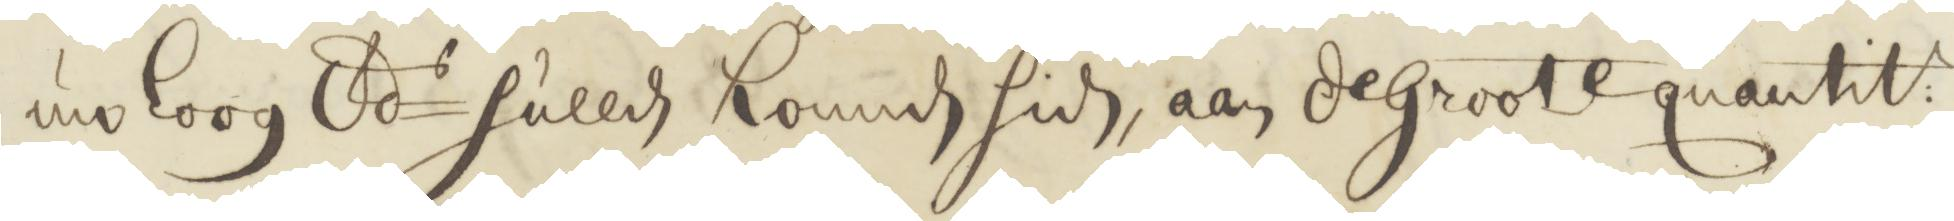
uw hoog Ed=s sullen konnen sien, aan de groote quantit:t
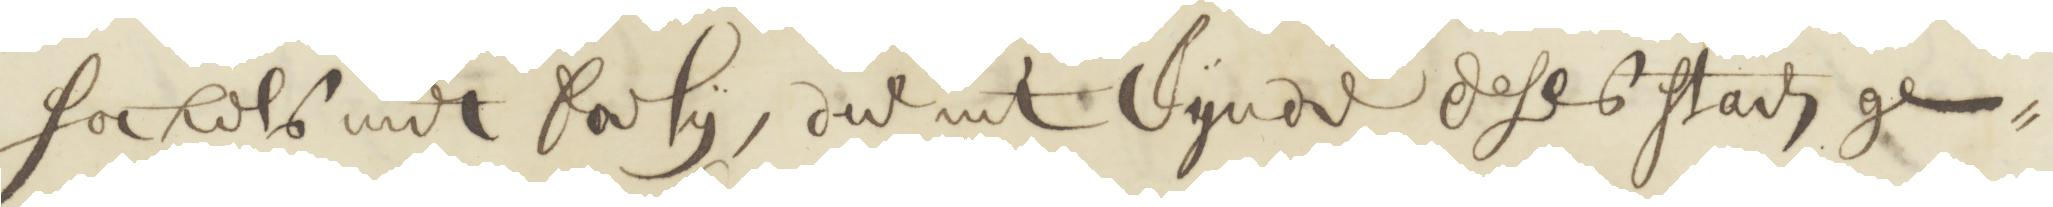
sockels met foelij, die in't Eijnde deses staen ge„
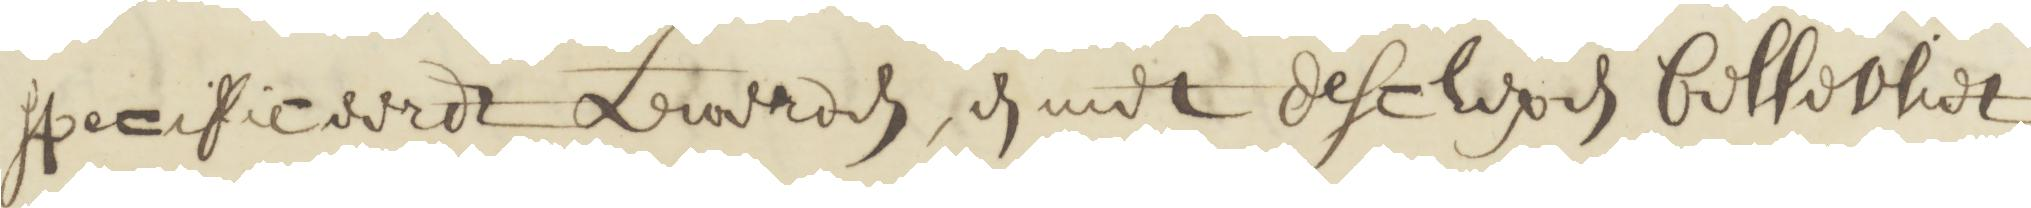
specificeerdt tewerden, en met de schepen bellevliet
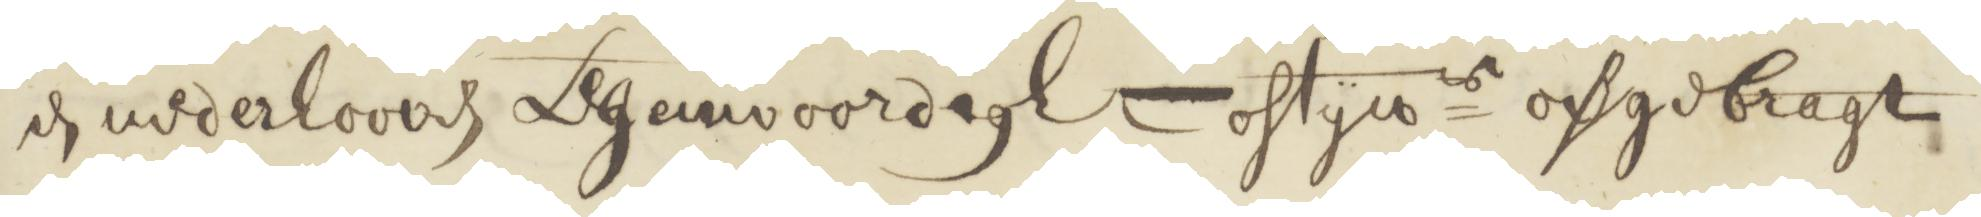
en nederhooven tegenwoordigh costijw=ts overgebragt
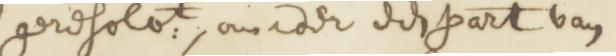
geresolv:t, om ider eerpart van
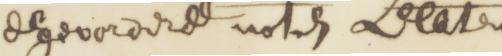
de gevorderde noten telaten
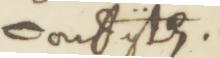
confijten.
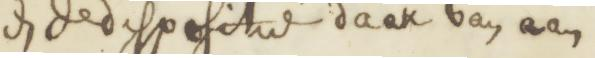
en de dispositie daar van aan
